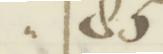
„ 85
